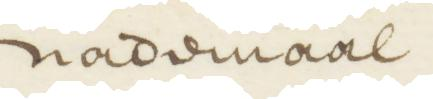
nademaal
